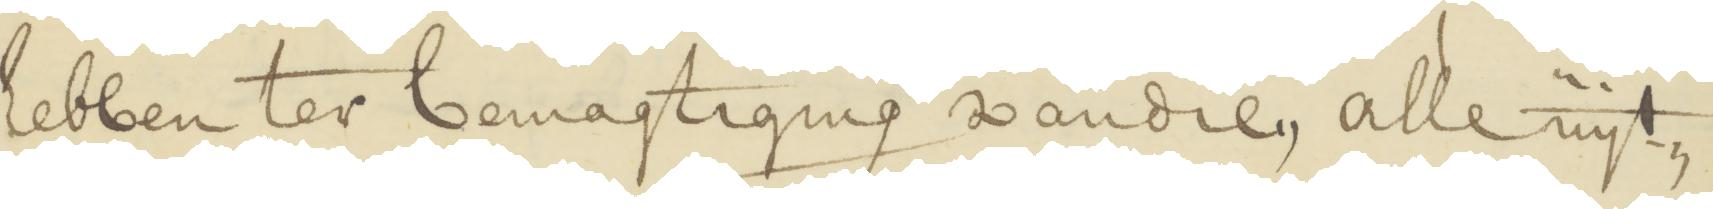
hebben ter bemagtiging vandie„ alle uijt„
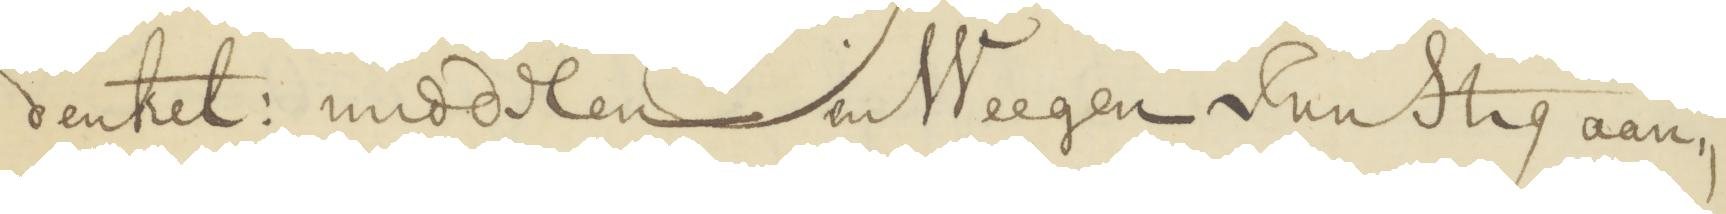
d enkel: middelen inWeegen Ernstig aan„
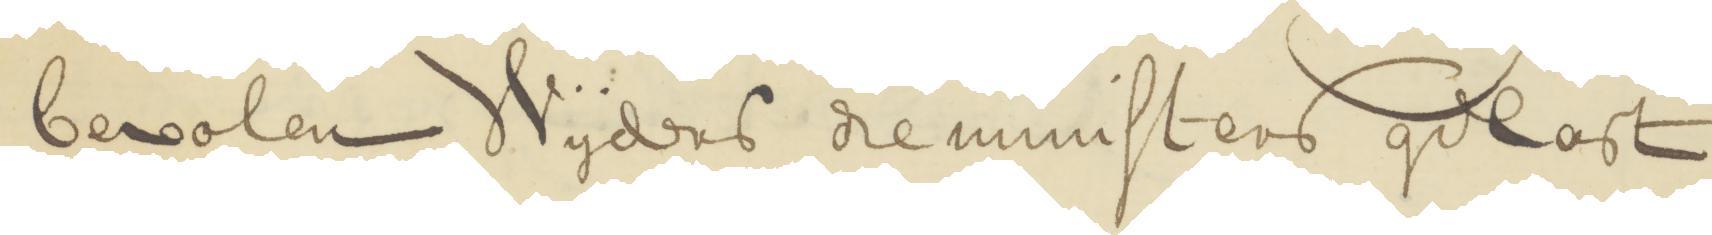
bevolen Wijders die ministers gelast
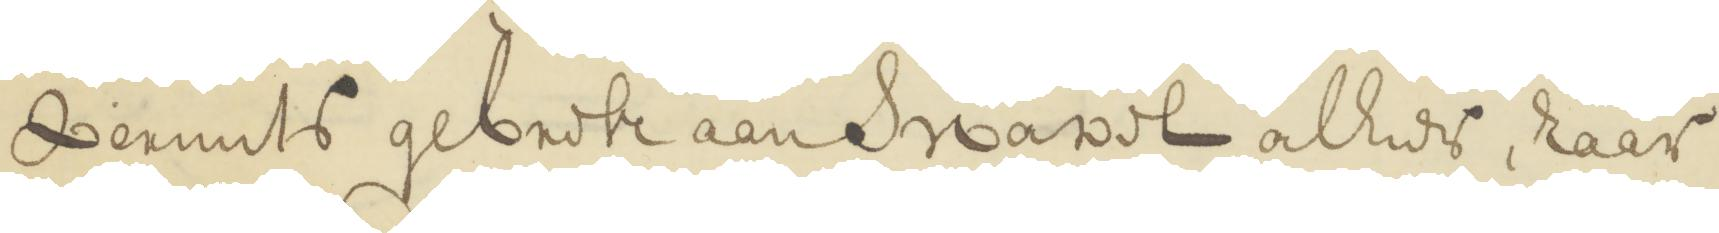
permits gebrek aanswavel alhier, haar
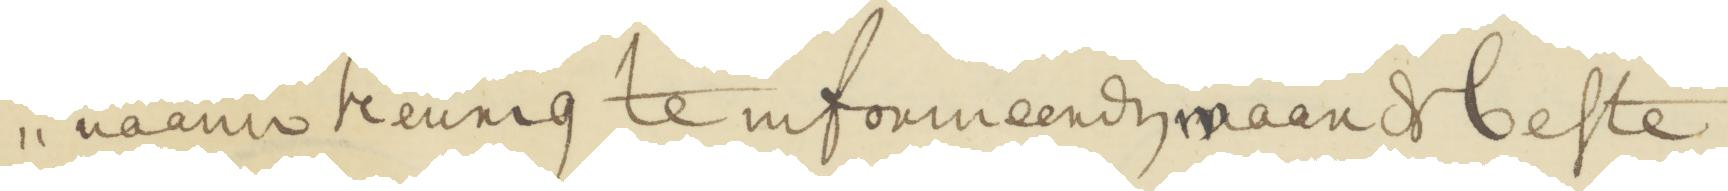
„naauw keurig te informeeren maar de beste
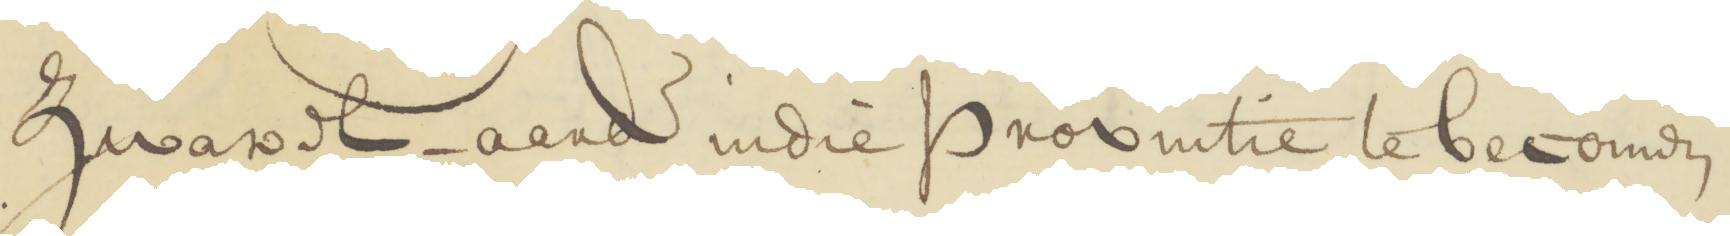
Zwavel aarde indie Provintie te becomen
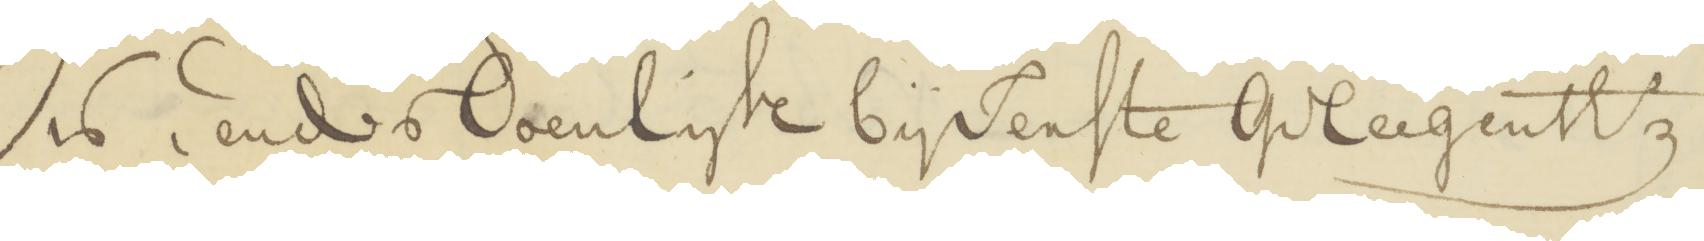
is, endes doenlijk bij eerste geleegentheid
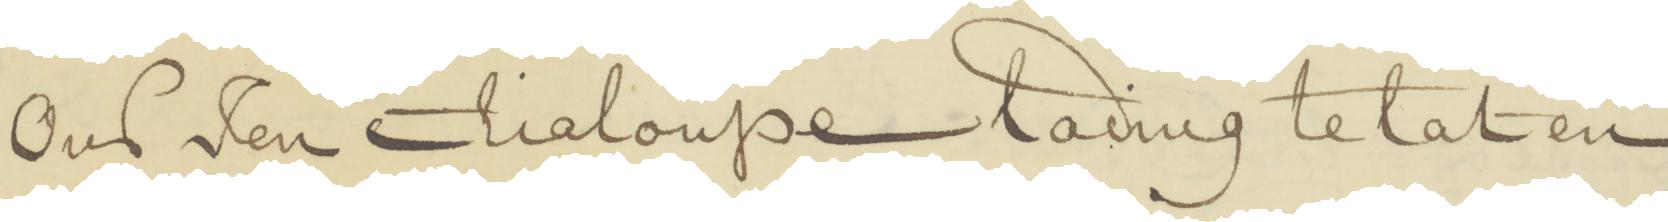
ons Een chialoupe lading te laten
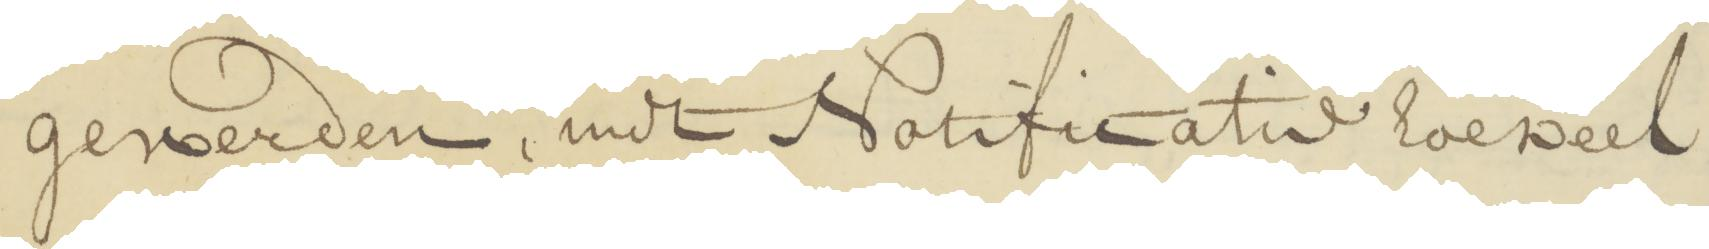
gewerden, met Notificatie hoeveel
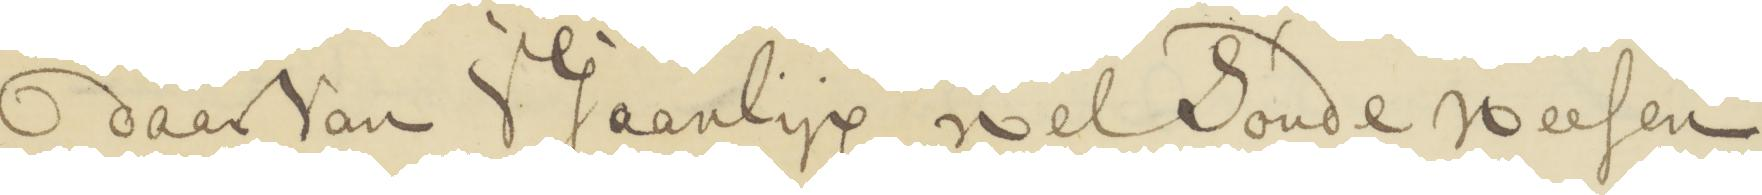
daarvan s'Jaarlijx wel soude weesen
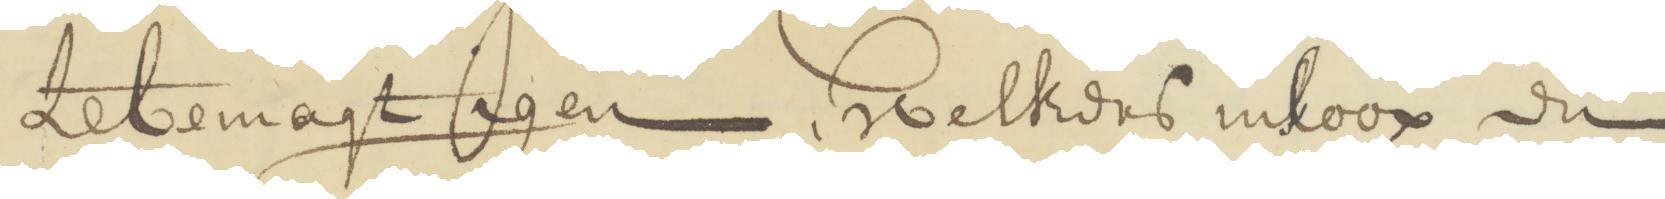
tebemagtigen welkers inkoop en
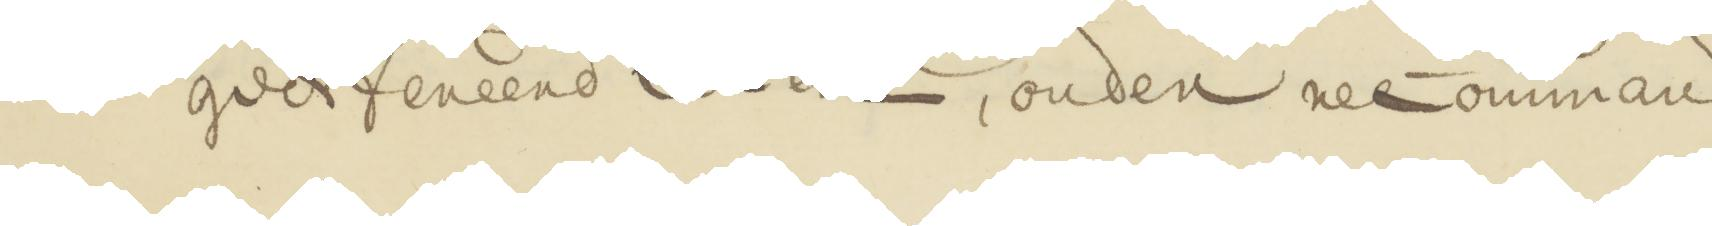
magtige prijsen wij prealabel tot onser
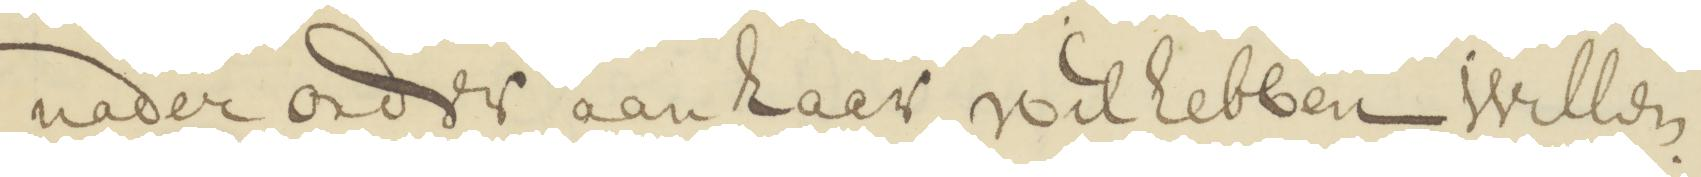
nader order aan haar wil hebben willen
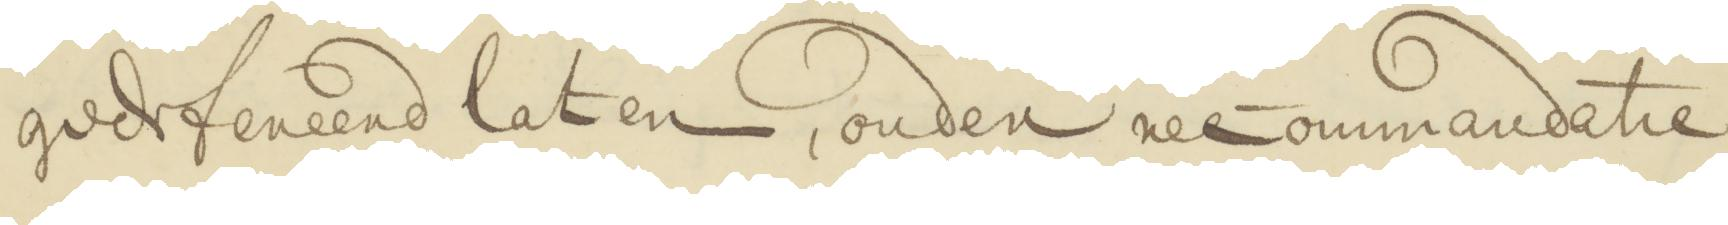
gedefereerd laten, onder recommandatie
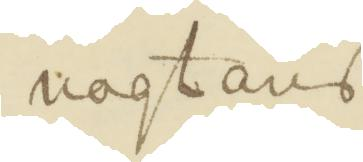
nogtans
